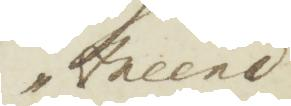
„treerd
